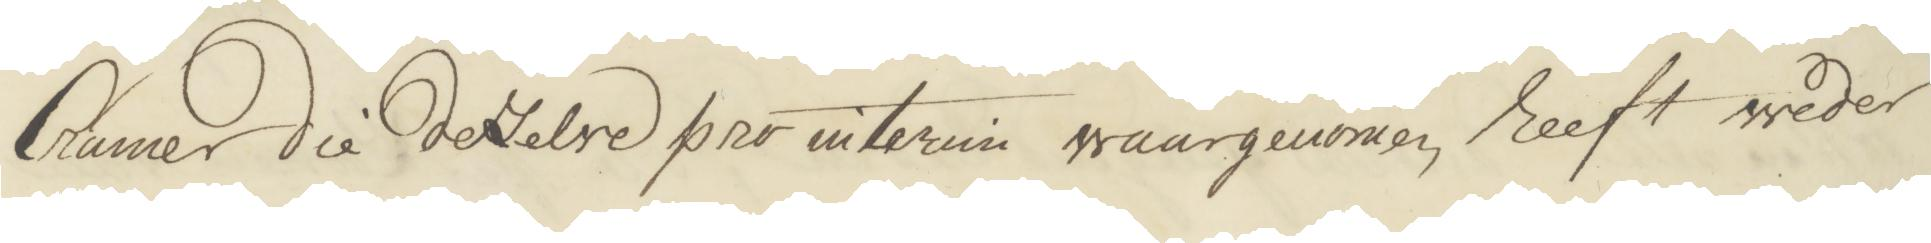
Cramer die dezelve pro interim waargenomen heeft weder
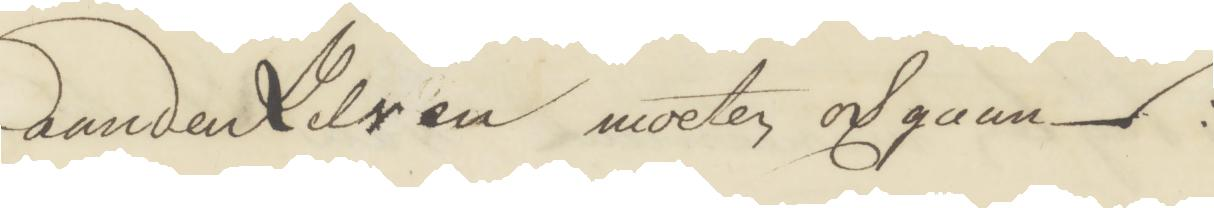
aan denzelven moeten overgaan — :
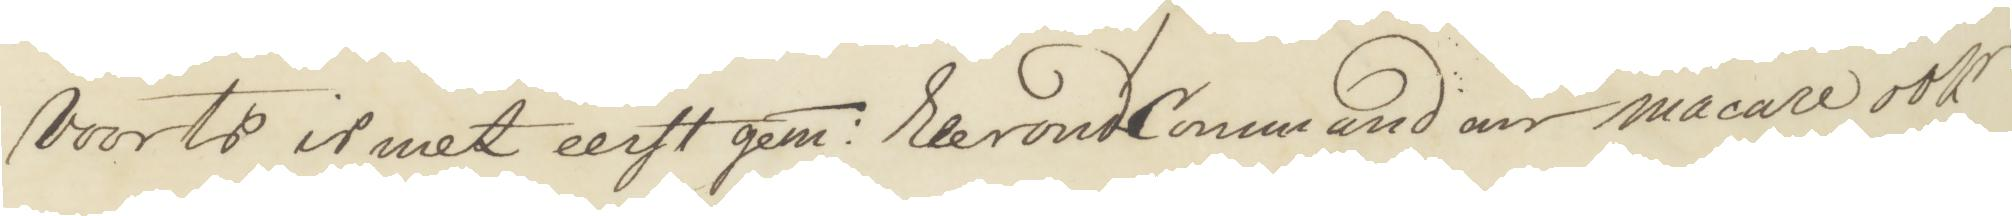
voorts is met eerst gem: heeroud Commandeur macare ook
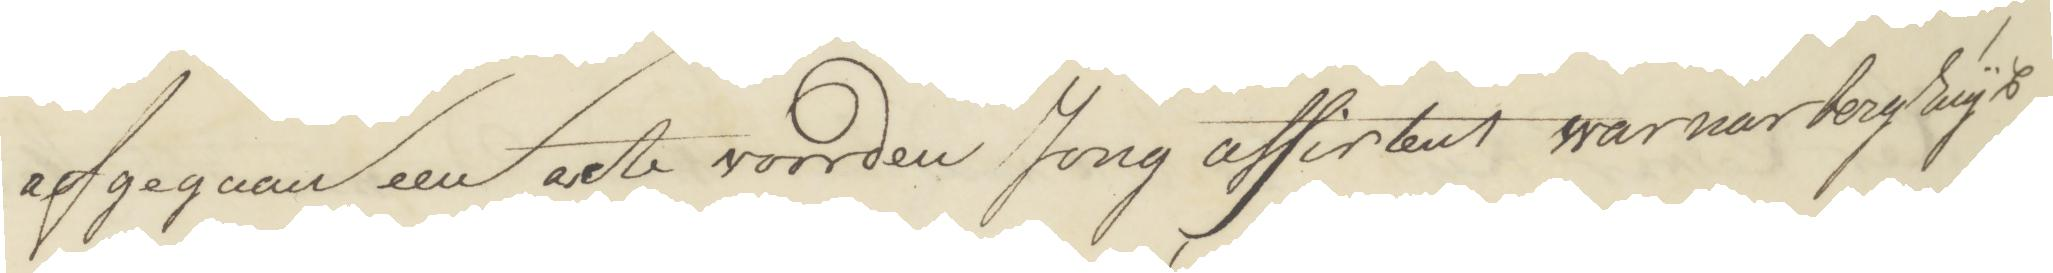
afgegaan een acte voorden Jong assistent warnar berghuijs
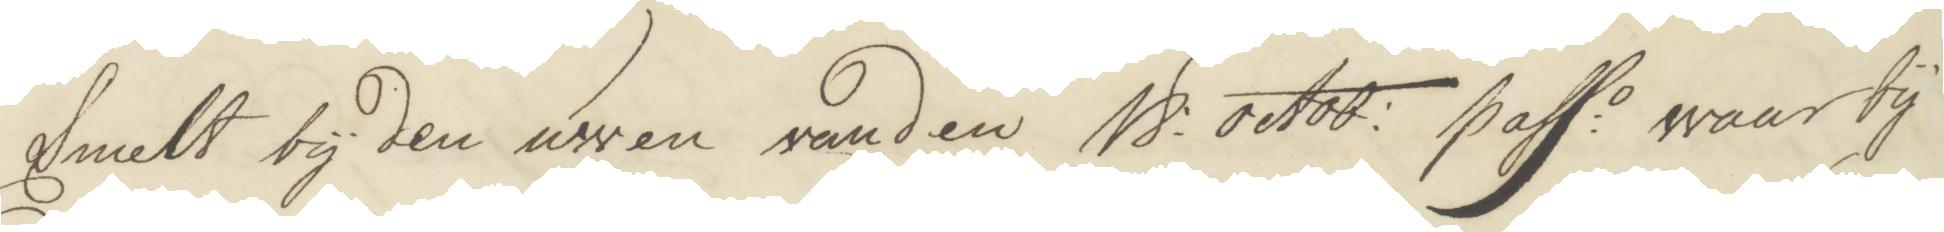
vermelt bij den uwen van den 18: octob: pass:o waar bij
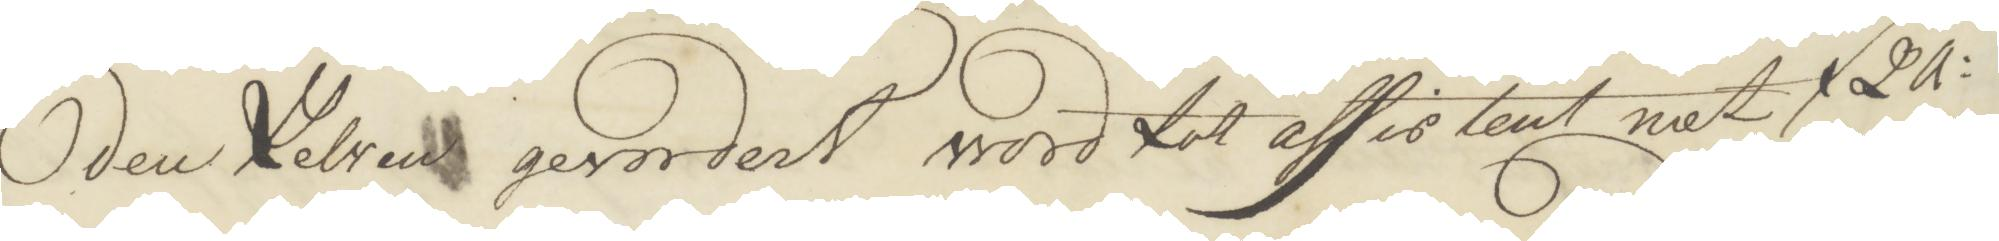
den zelven gevordert word tot assistent met ƒ 24:
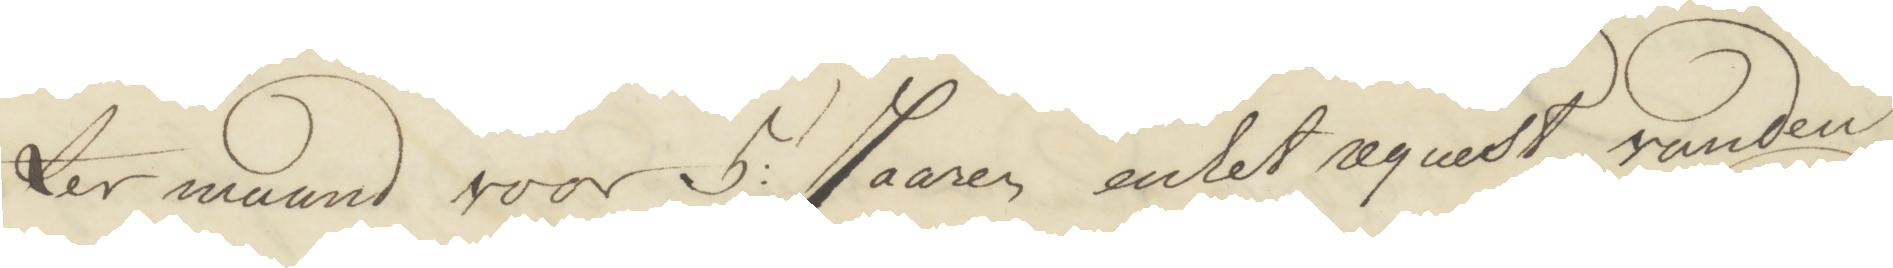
ter maand voor 5: Jaaren enhet request vanden
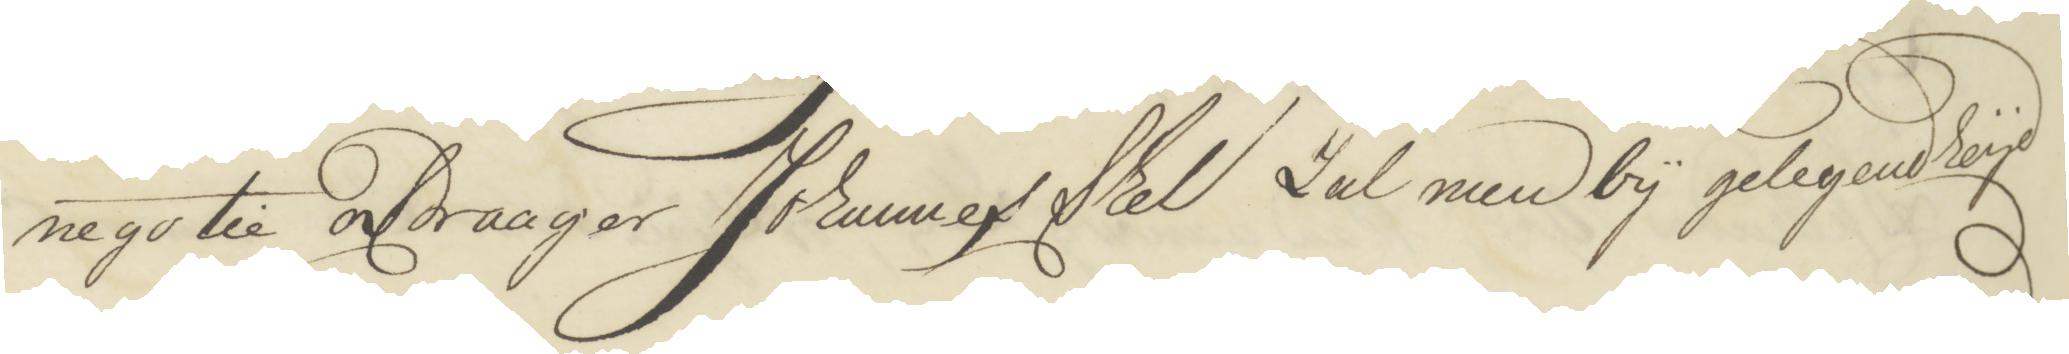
negotie overdraager Johannes verhel zal men bij gelegendheijd
